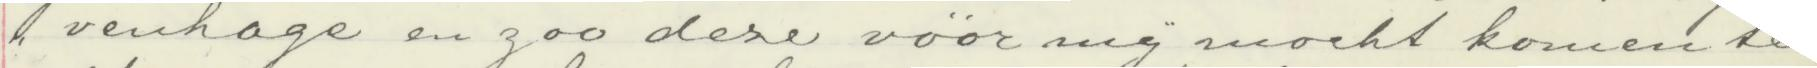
„ venhage en zoo deze voor mij mocht komen te
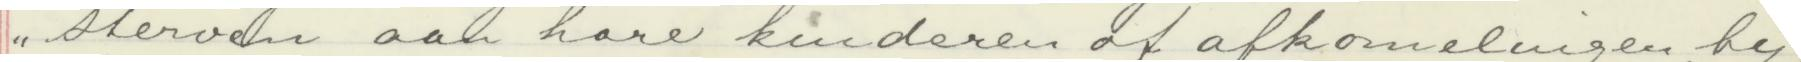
„ sterven aan hare kinderen of afkomelingen bij
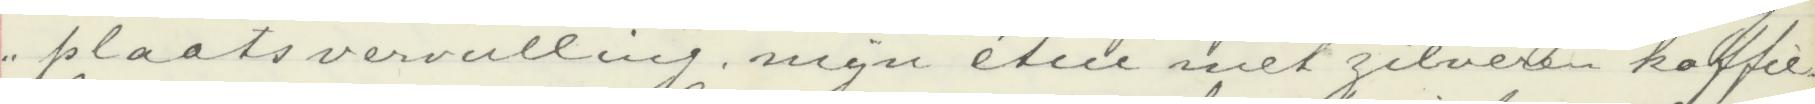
„ plaatsvervulling, mijn étui met zilveren koffie
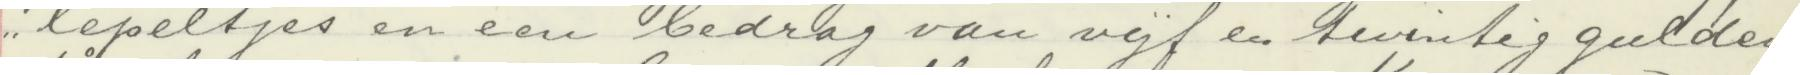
„ lepeltjes en een bedrag van vijf en twintig gulden
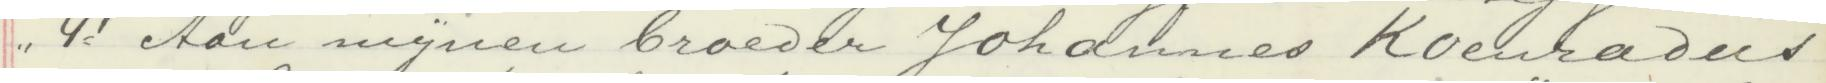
„ 4=o Aan mijnen broeder Johannes Koenradus
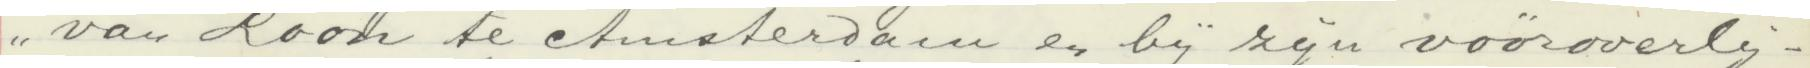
„ van Loon te Amsterdam en bij zijn vóóroverlij-
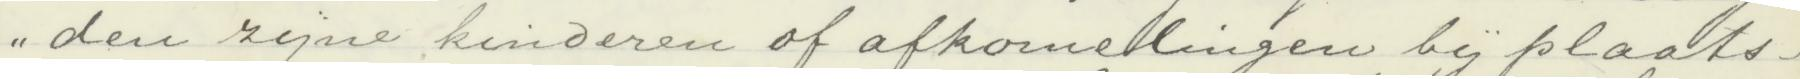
„ den zijne kinderen of afkomelingen bij plaats-
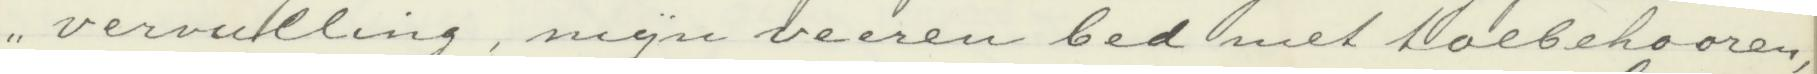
„ vervulling, mijn veeren bed met toebehooren,
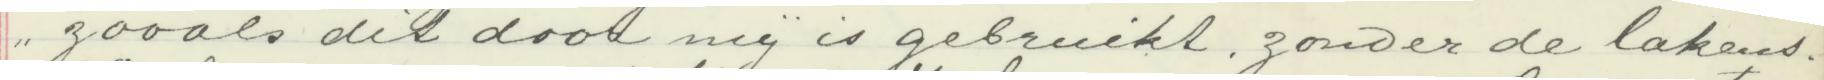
„ zooals die door mij is gebruikt, zonder de lakens.
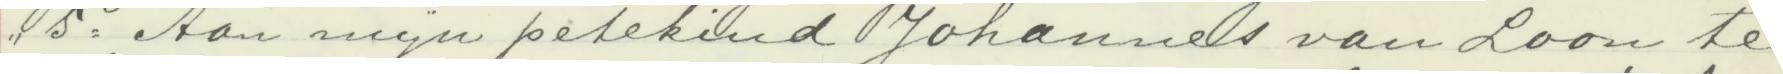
„ 5=o Aan mijn petekind Johannes van Loon te
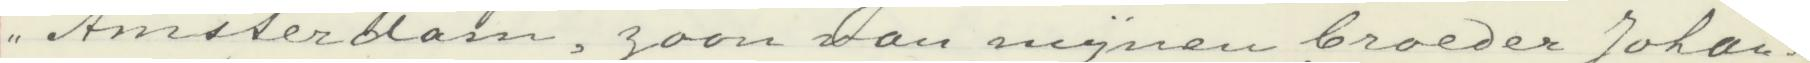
„ Amsterdam, zoon van mijnen broeder Johan-
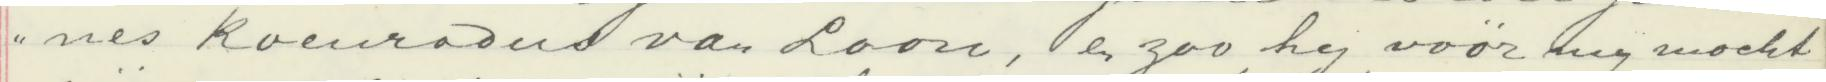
„ nes Koenradus van Loon, en zoo hij vóór mij mocht
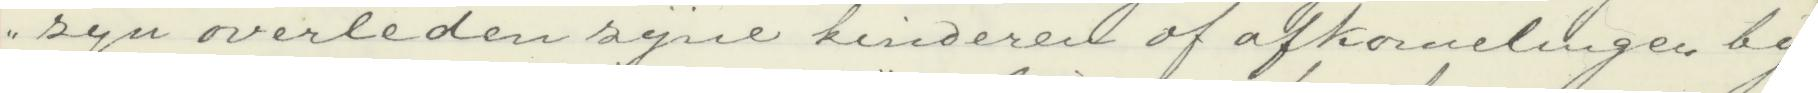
„ zijn overleden zijne kinderen of afkomelingen bij
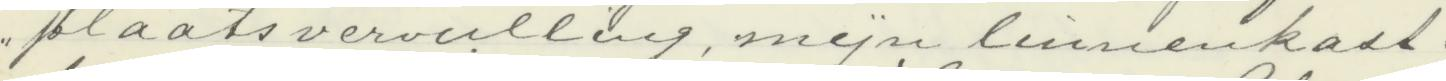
„ plaatsvervulling, mijn linnenkast
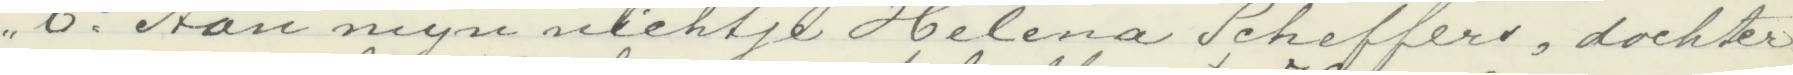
„ 6=o Aan mijn nichtje Helena Scheffers, dochter
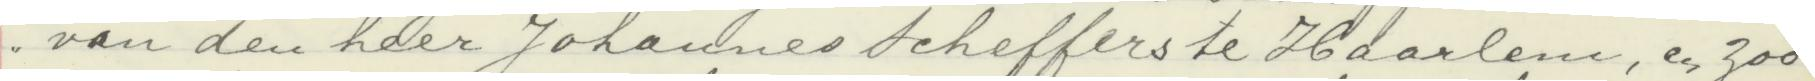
„ van den heer Johannes Scheffers te Haarlem, en zoo
